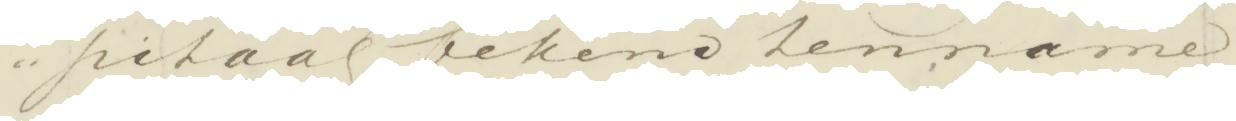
„pitaal bekend ten name
